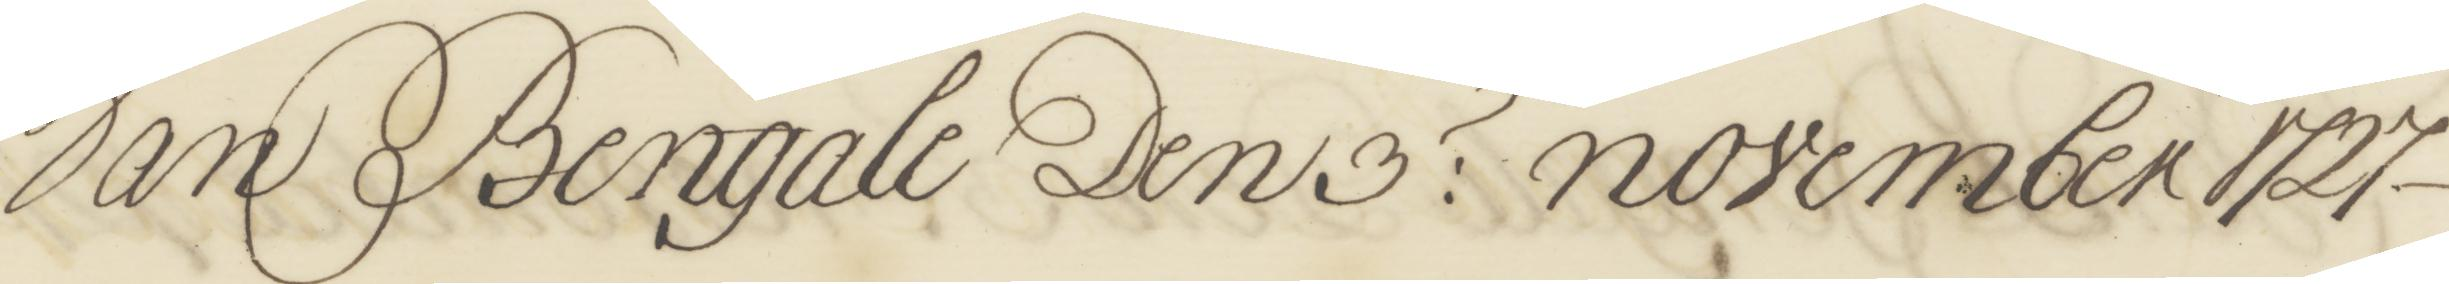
Van Bengale Den 3:' november 1727.
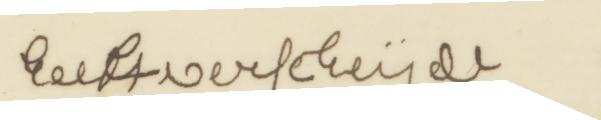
heeft verscheijde
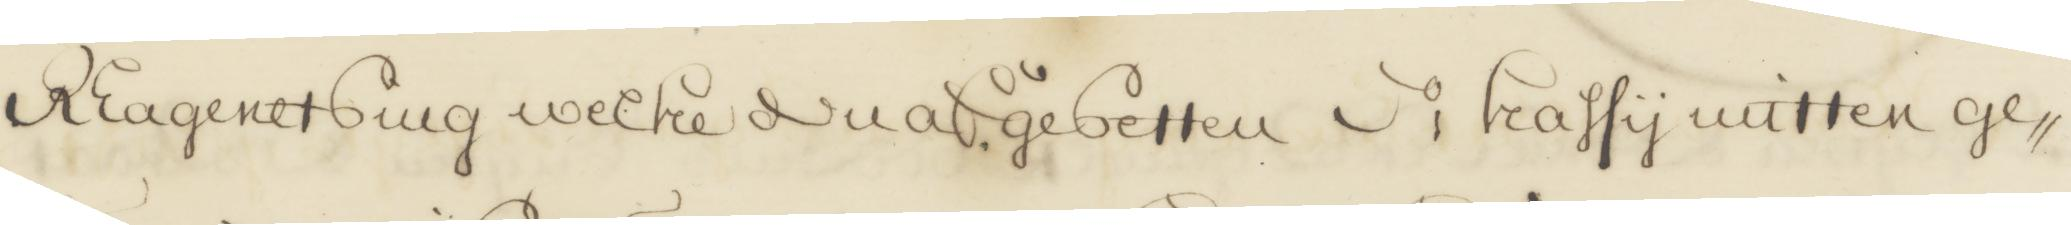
Rhageretsing welke den afgesetten _:o kassij mitten ge„
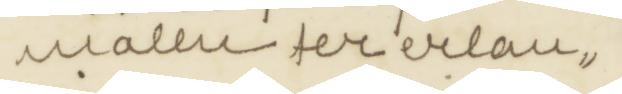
malen ter erlan„
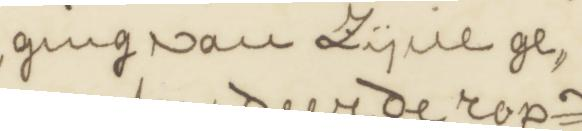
„ging van zijne ge„
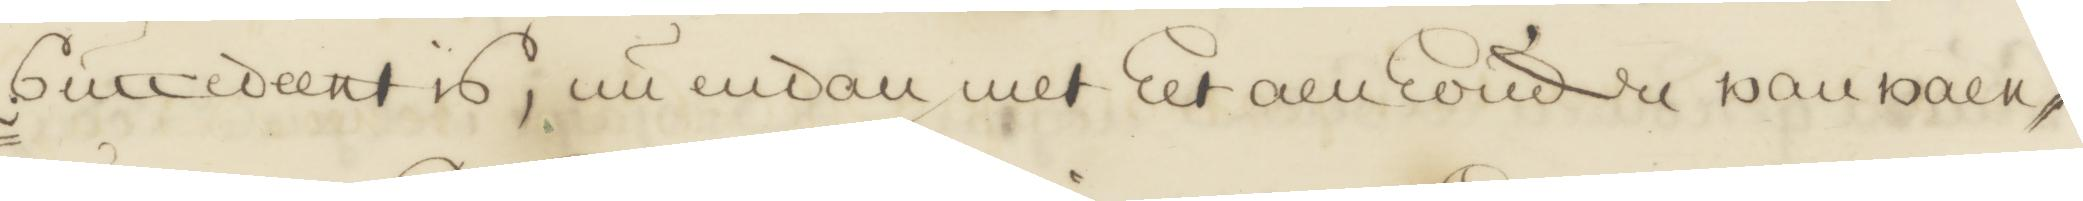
succedeert is, nu en dan met het aenhouden van vaer„
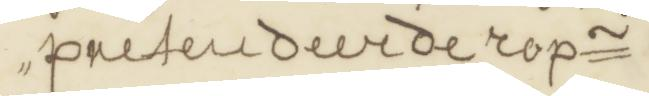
„pretendeerde rop=s
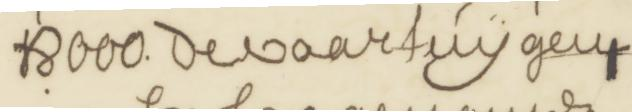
18000. devaartuijgen
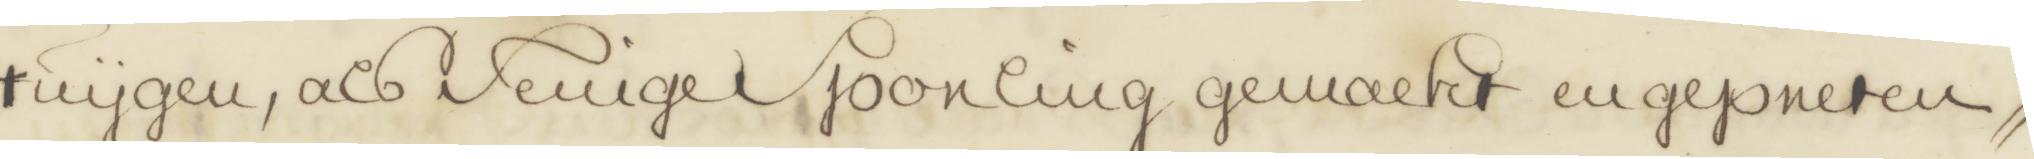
tuijgen, als Eenige Sporling gemaekt en gepreten„
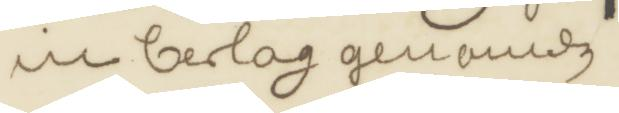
in beslag genomen
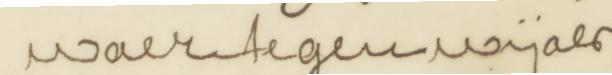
waertegen wij als
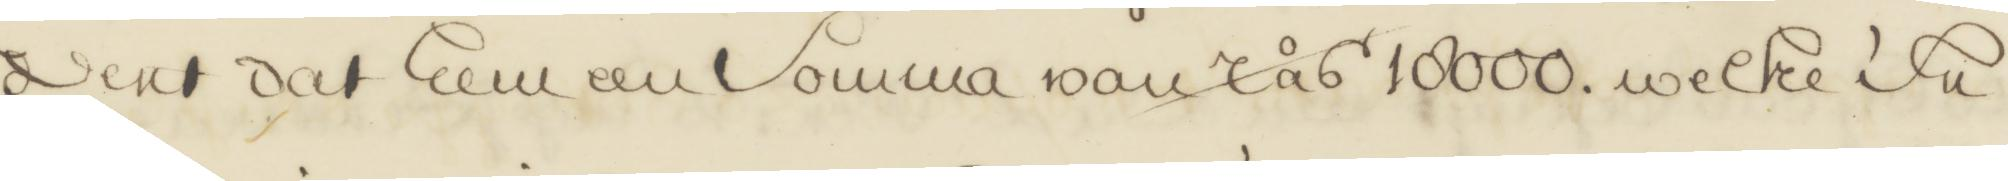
deert dat hem een Somma van ro/as 18000. welke 'Er
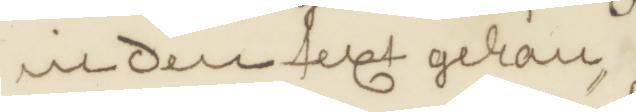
in den text gehan„
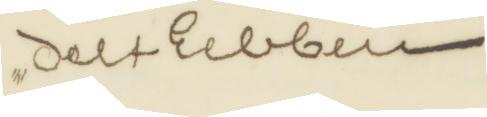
„delt hebben.
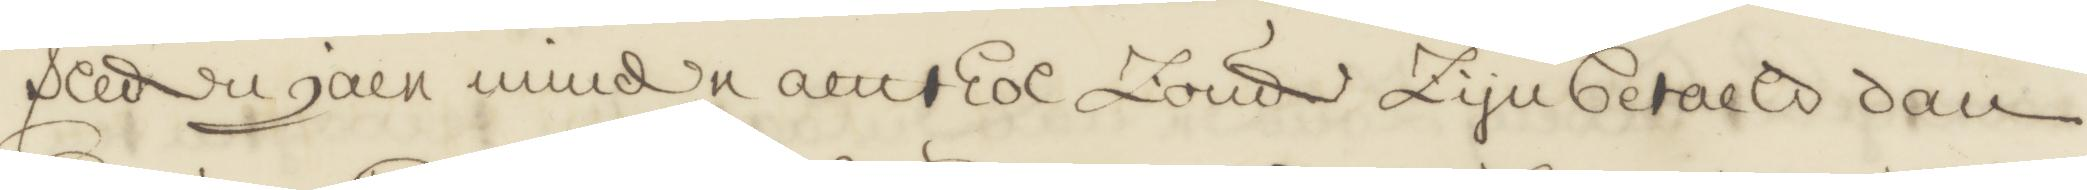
verleden jaer minder aenthol zoude zijn betaeld dan
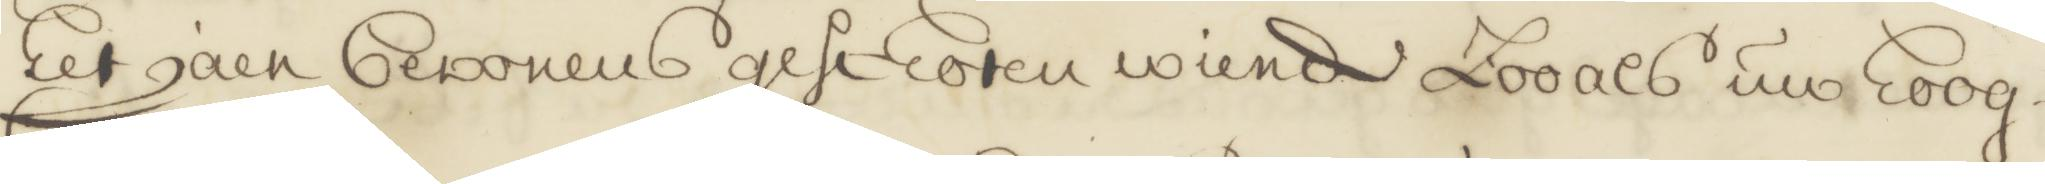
het jaer bevorens geschoten wierde zoo als uw hoog
